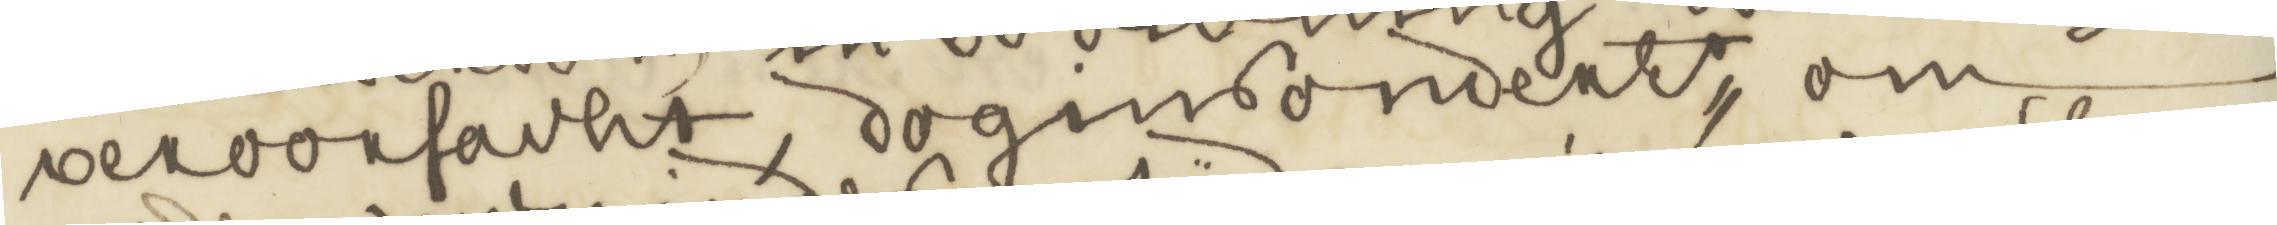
veroorsaekt, dog insonderht„ om
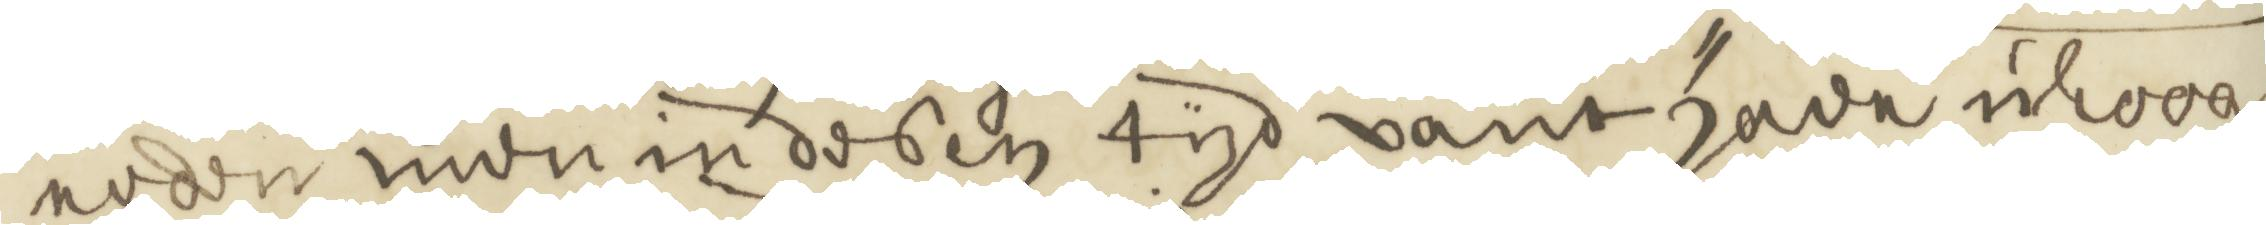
reden men in desen tijd van't jaer uhoog
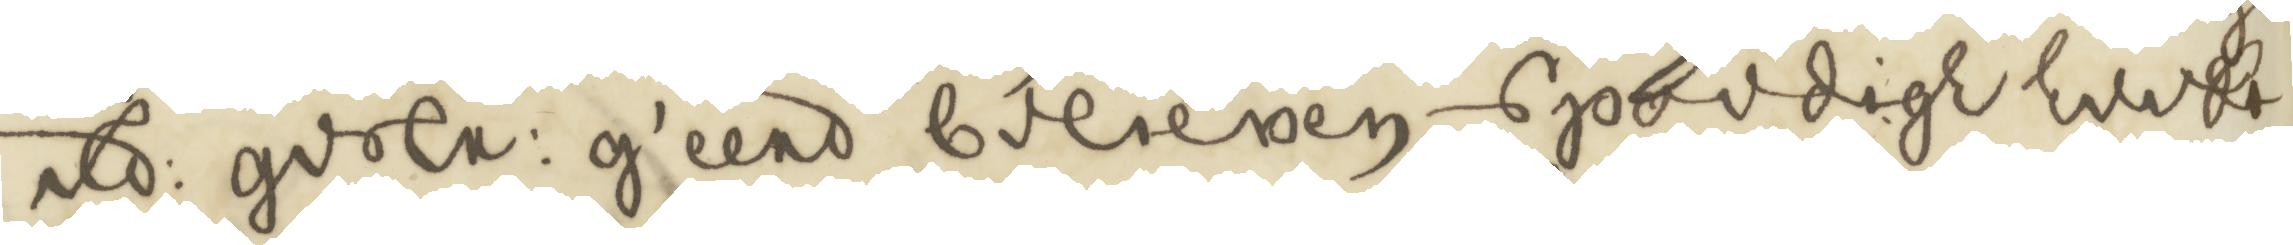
Ed: gestr: g’eerd believen spoedigh heeft
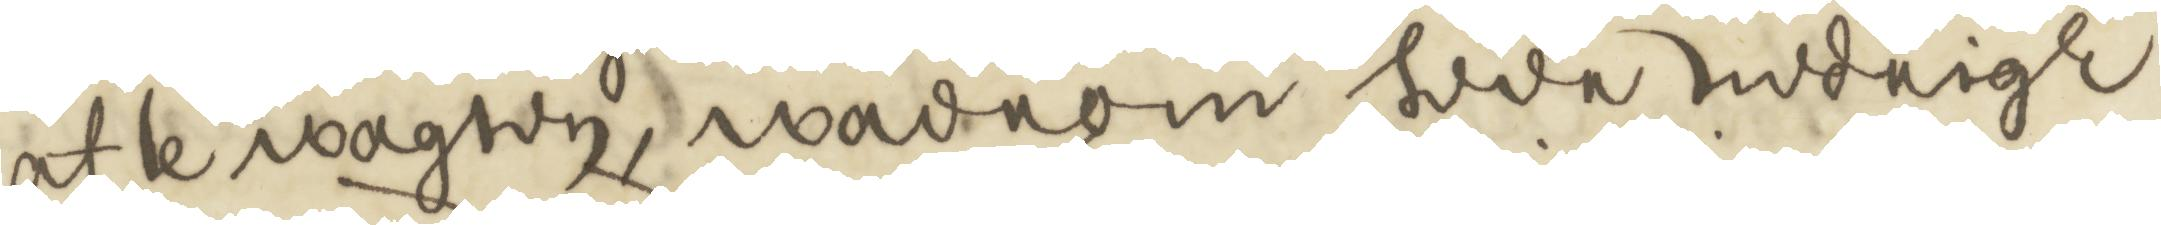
af te wagten, waerom seer nedrigh
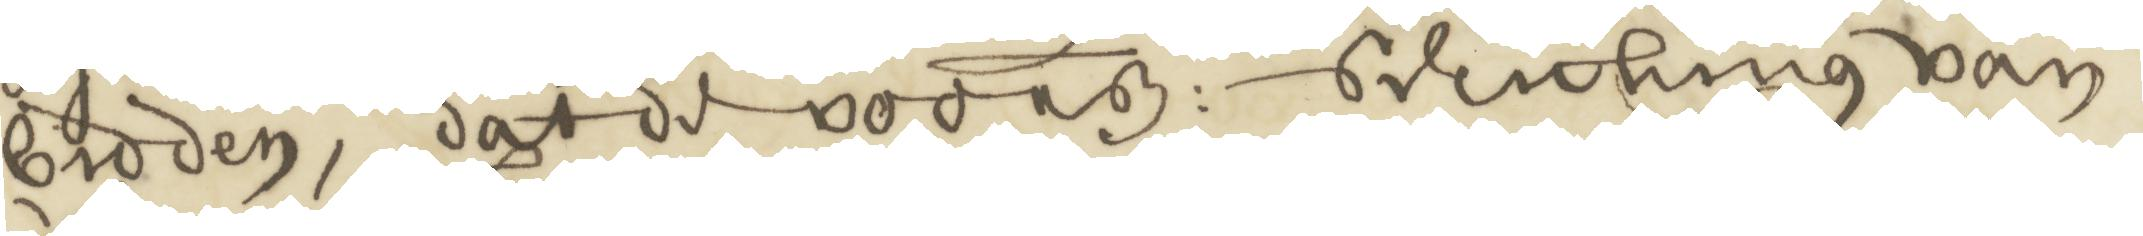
bidden, dat de voors: schicking van
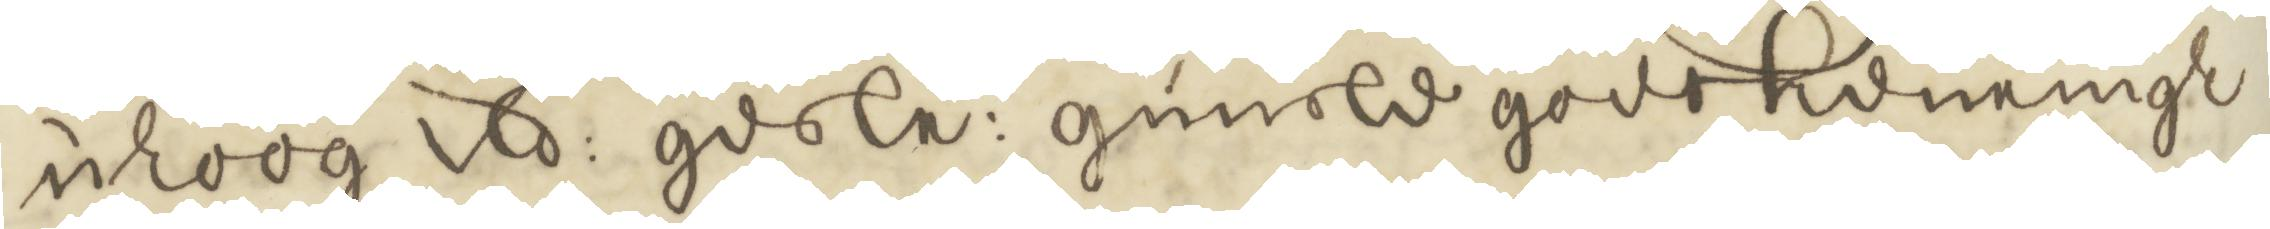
uhoog Ed: gestr: gunste goetkeuringh
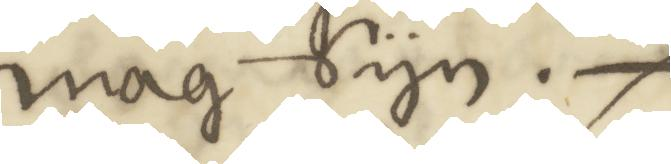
mag sijn.
